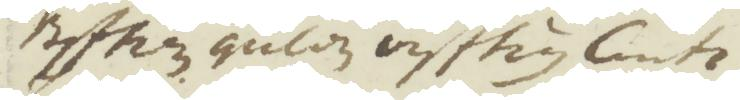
Vyftien gulden vyftig Cents
